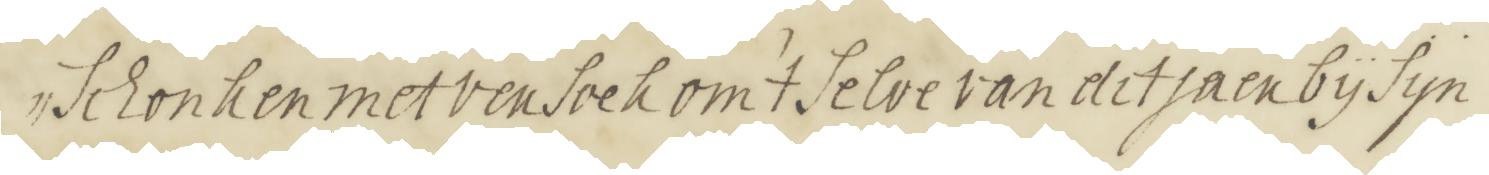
„schonken met versoek om ’t selve van dit jaer bij sijn
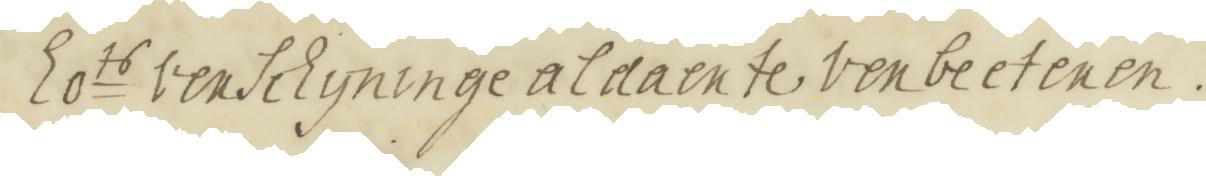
ho=ts verschijninge aldaer te verbeeteren.
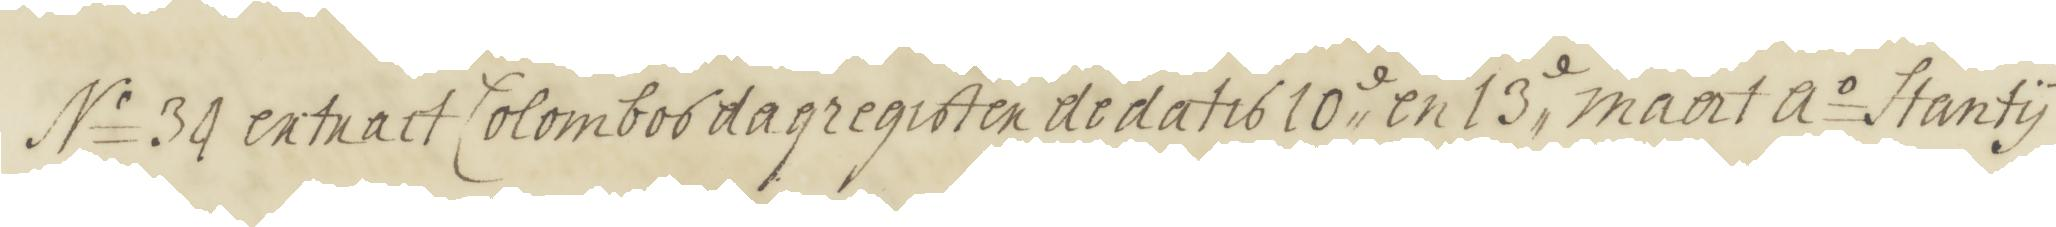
N=o 34 extract Colombos dagregister de datis 10„e en 13„e maert A=o stantij
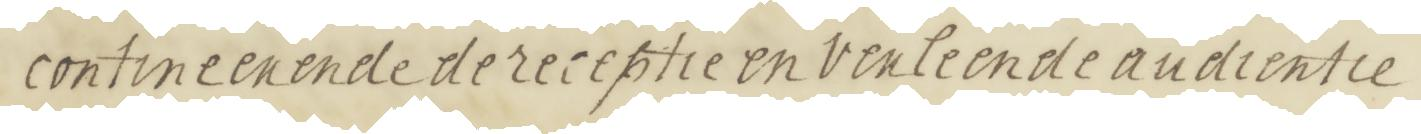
contineerende de receptie en verleende audientie
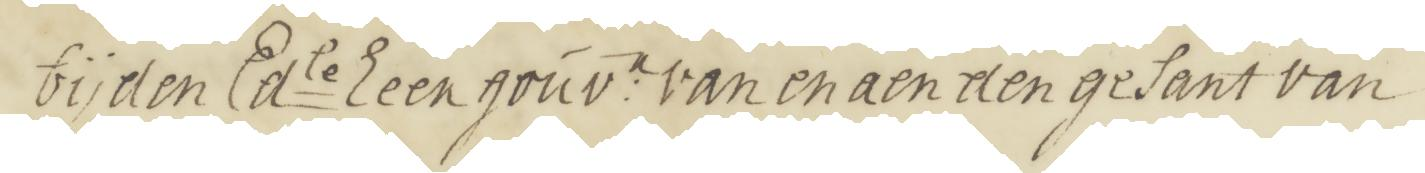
bij den Ed=le heer gouv:r van en aen den gesant van
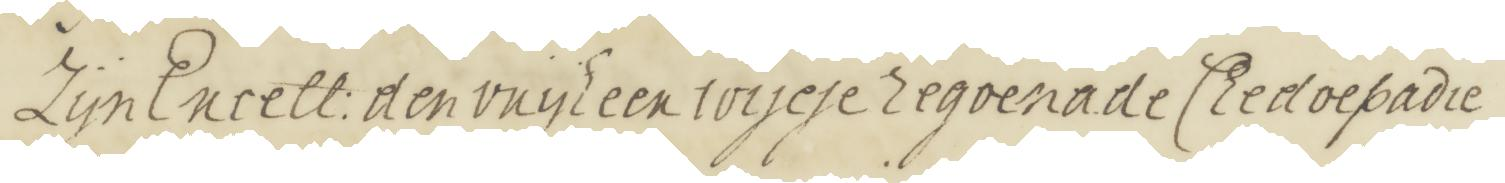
zijn Excell: den vrijheer wijeje regoenade Chedoepadie
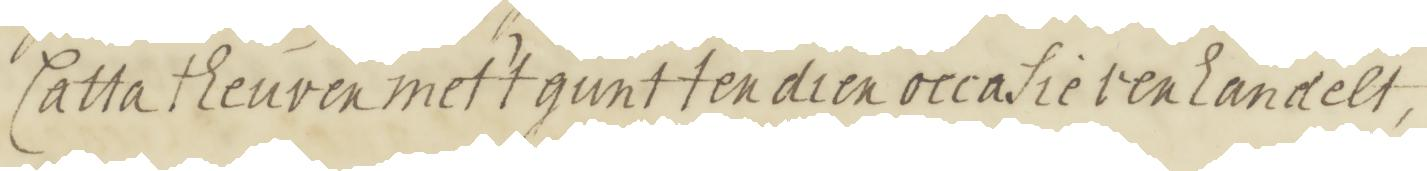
Catta theuver met ’t gunt ter dier occasie verhandelt,
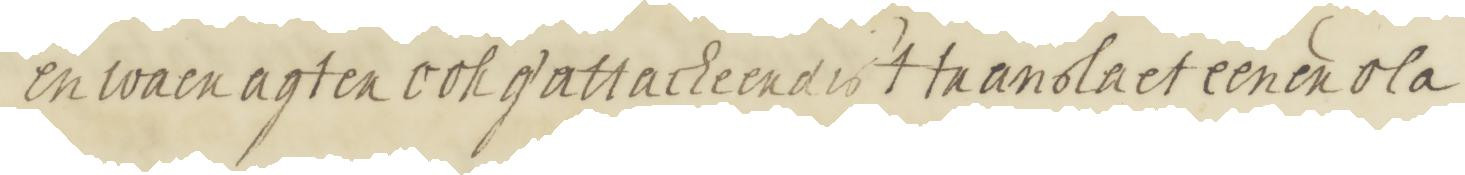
en waer agter ook g’attacheerd is ’t translaet eener ola
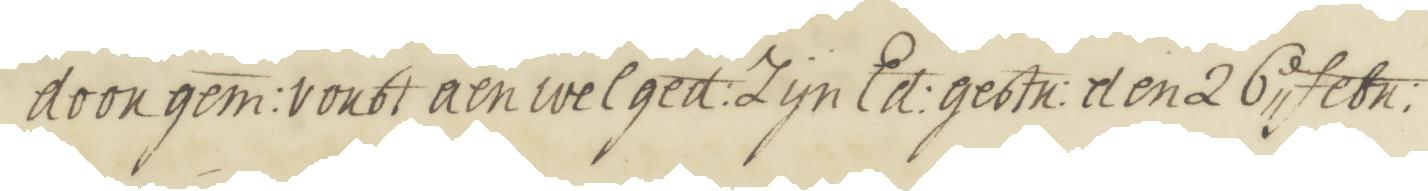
door gem: vorst aen wel ged: zijn Ed: gestr: den 26„e febr:
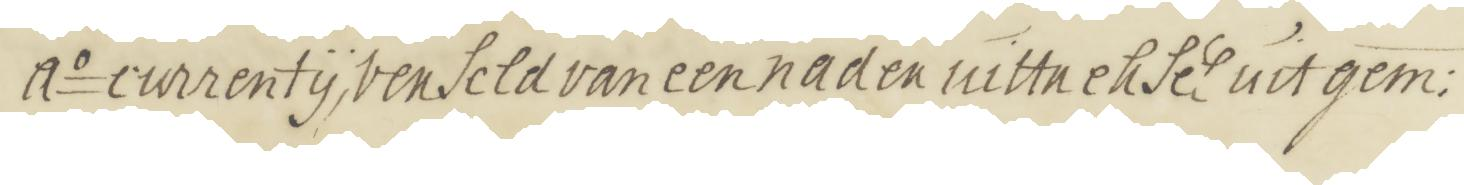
A=o currentij, verseld van een nader uittreksel uit gem:
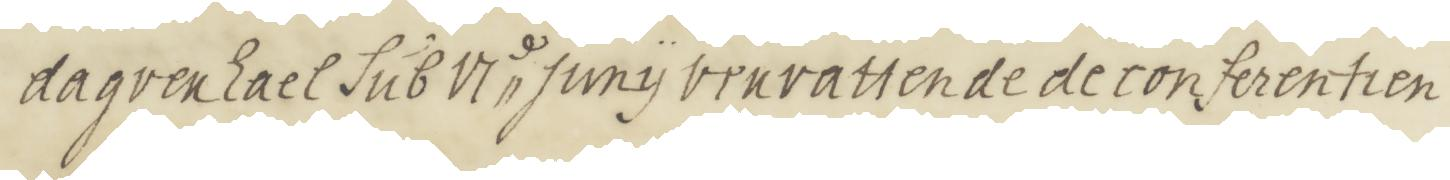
dagverhael sub 17„e junij vervattende de conferentien
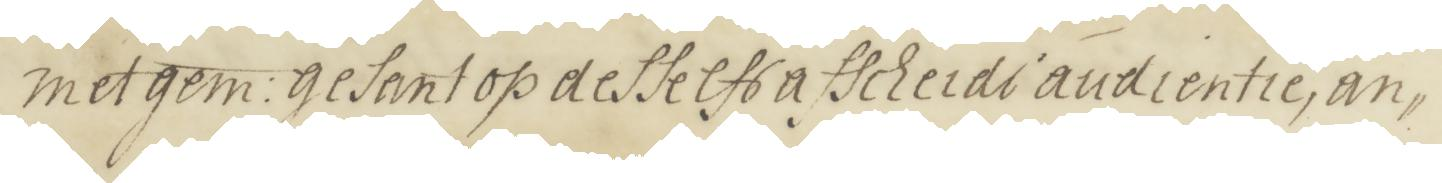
met gem: gesant op desselfs afscheids audientie, an„
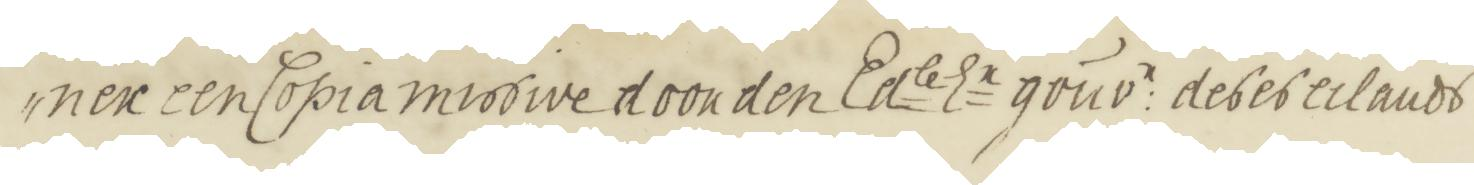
„nex een Copia missive door den Ed=le h=r gouv:r deses eilands
